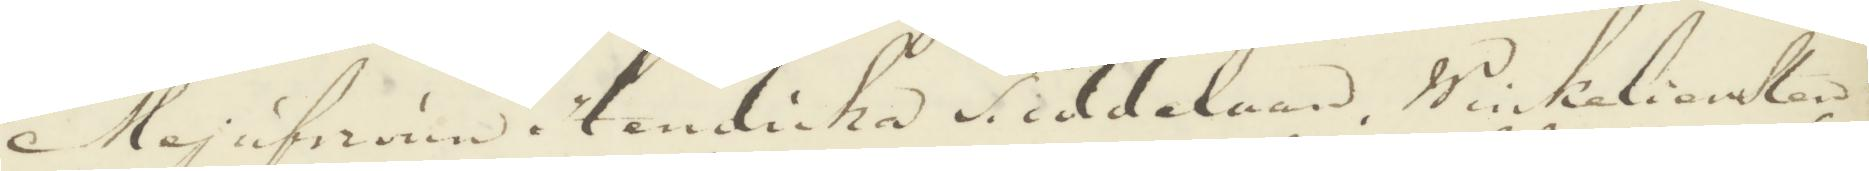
Mejufvrouw Hendrika Tiddelaar, Winkelierster,
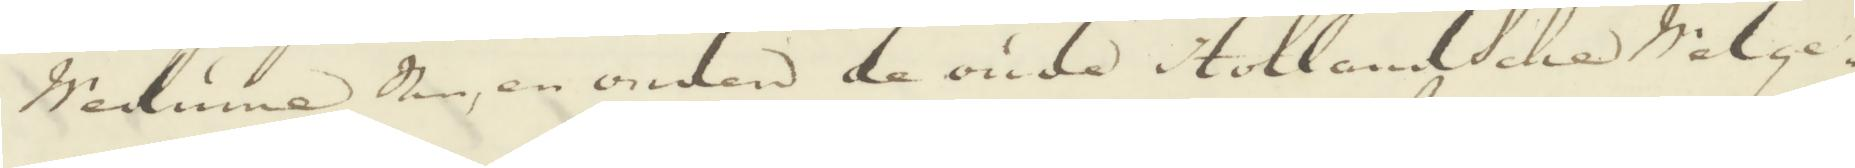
Weduwe van en onder de oude Hollandsche Wetge„
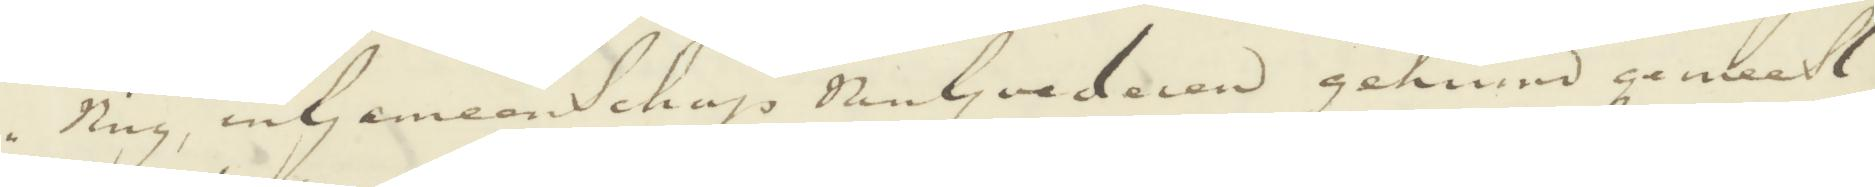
„vig, in Gemeenschap van Goederen gehuwd geweest
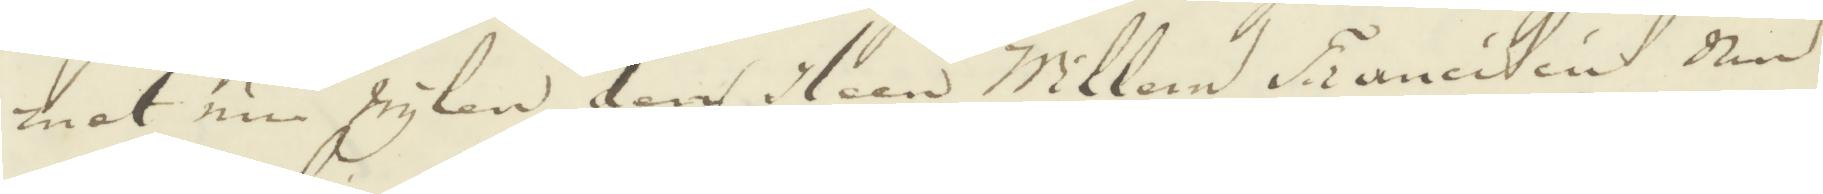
met nu wijlen den Heer Willem Franciscus van
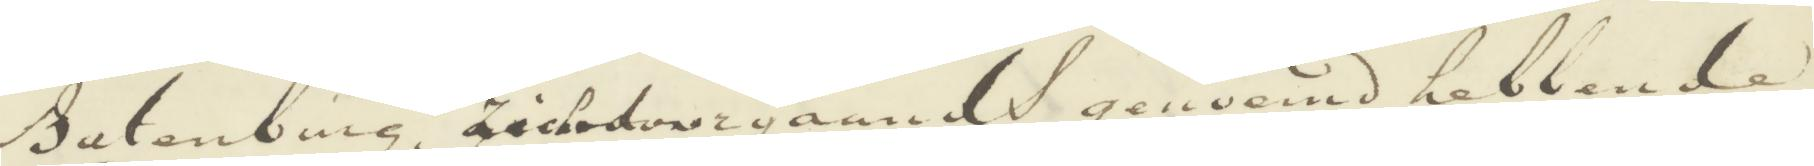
Batenburg zich doorgaands genoemd hebbende
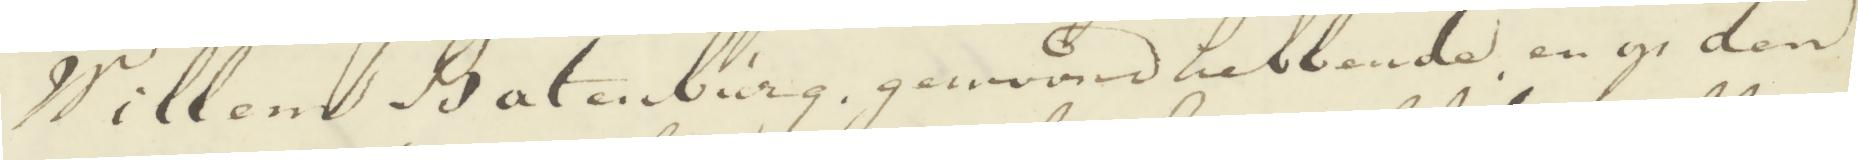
Willem Batenburg, gewoond hebbende, en op den
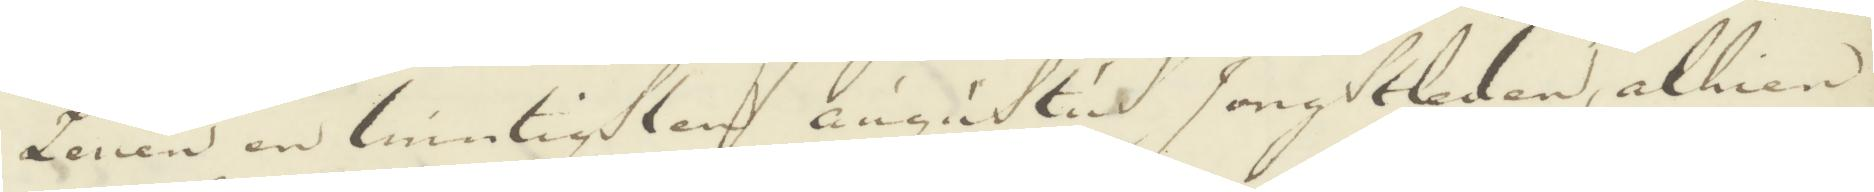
Zeven en twintigsten augustus Jongstleden, alhier
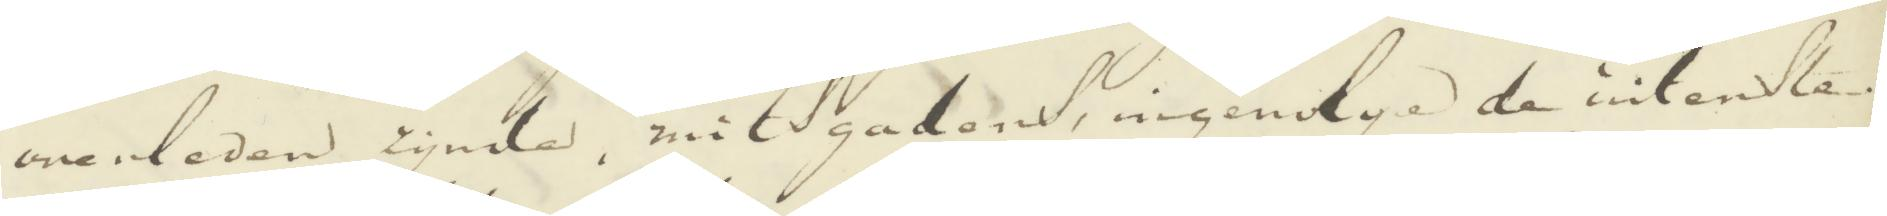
overleden zijnde, mitsgaders, ingevolge de uiterste
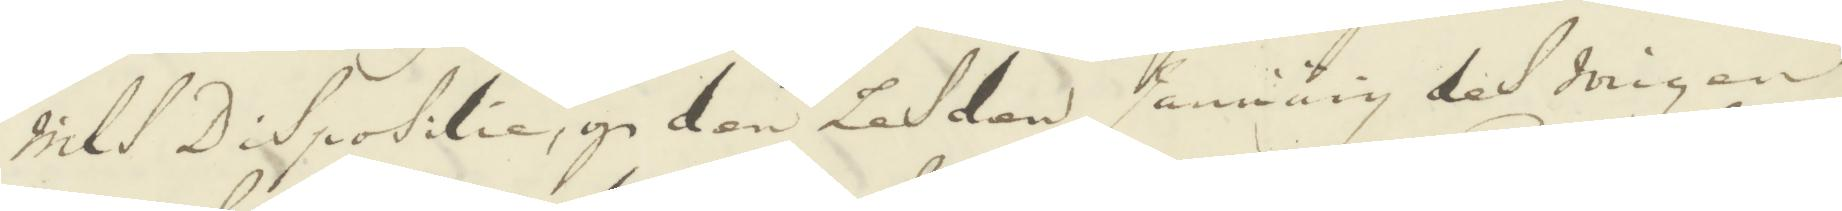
wils Dispositie, op den zesden January des vorigen
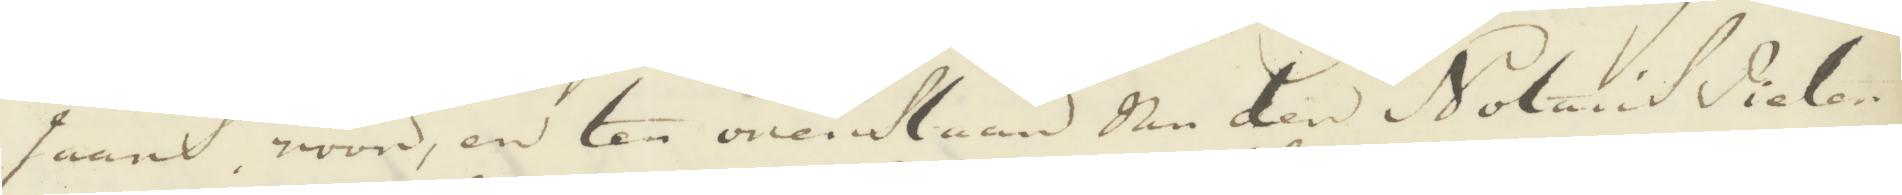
Jaars, voor, en ten overstaan van den Notaris Pielen
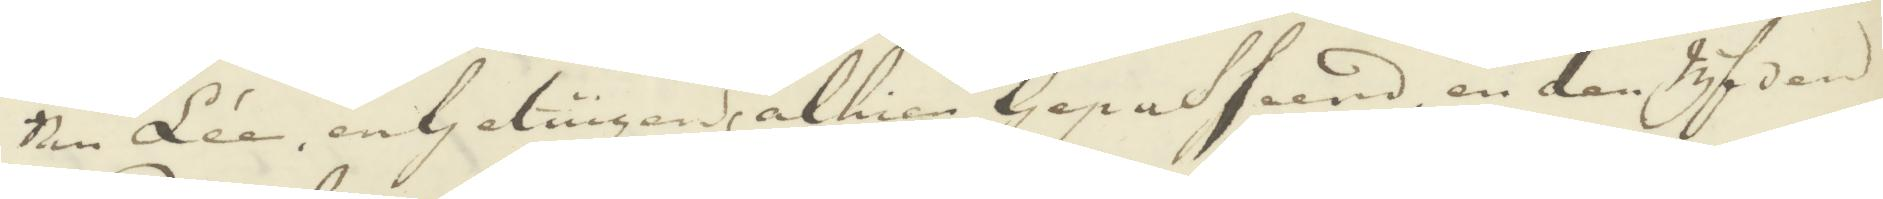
van Lee, en Getuigen, alhier Gepasseerd, en den Vyfden
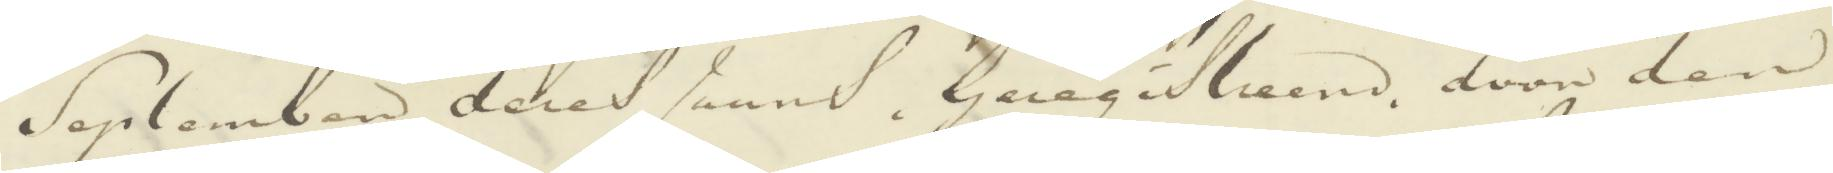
September dezes Jaars, Geregistreerd, door den
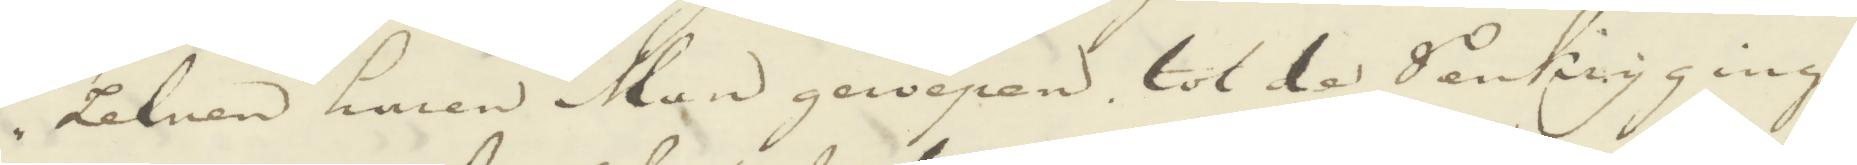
„zelven harer Man geroepen, tot de Verkrijging
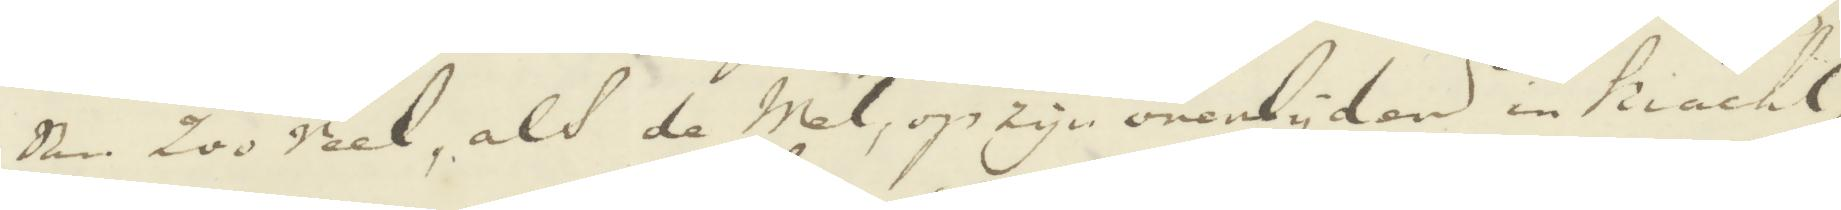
van zoo veel, als de Wet, op zijn overlijden in kracht
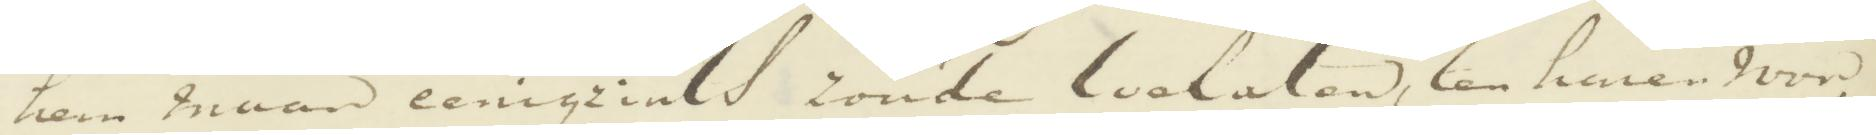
hem maar eenigzints zoude toelaten, ten harer voor„
